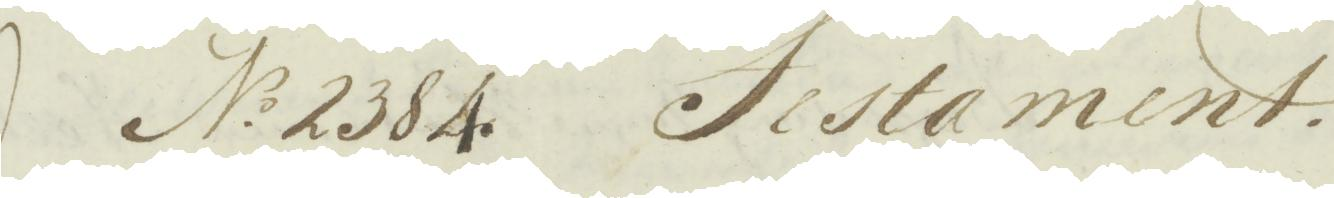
N.o 2384. Testament.
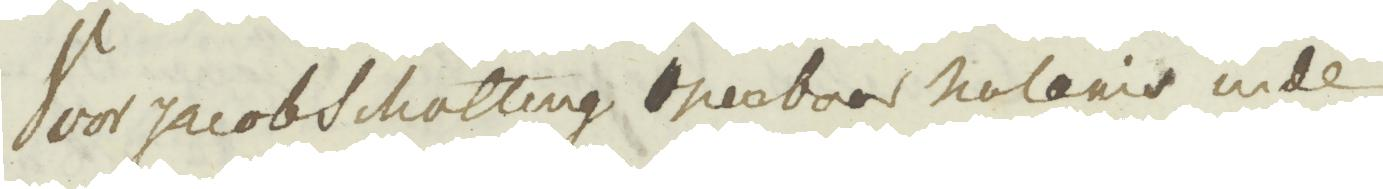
Voor Jacob Scholting Openbaar notaris inde
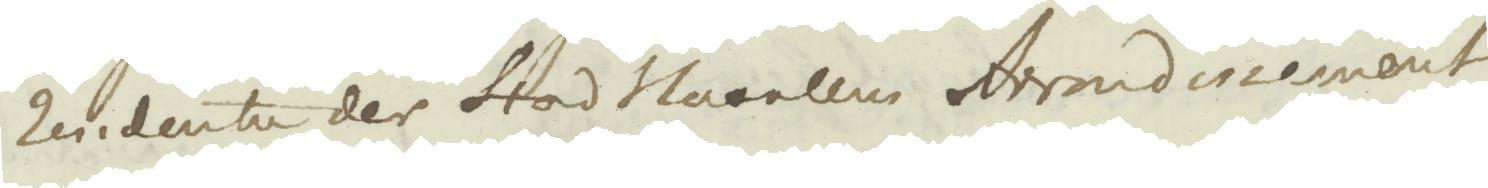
residentie der Stad Haarlem Arrondissement
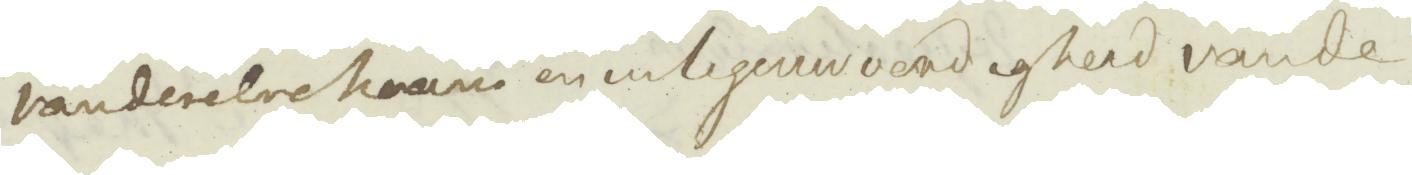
van deselve naam en in tegenwoordigheid van de
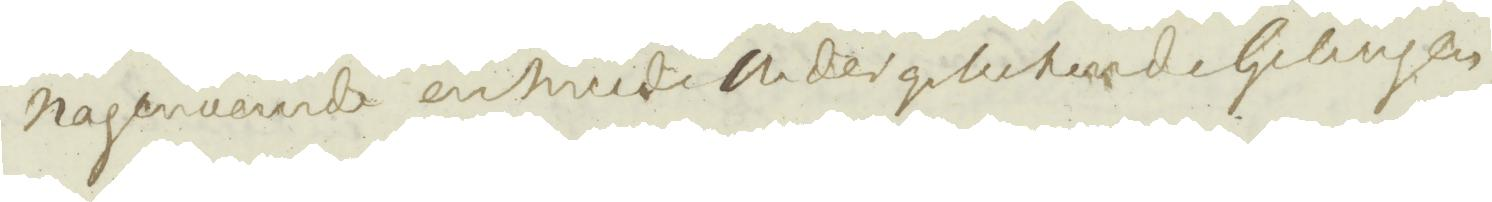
nagenoemde en meede ondergeteekende Getuigen
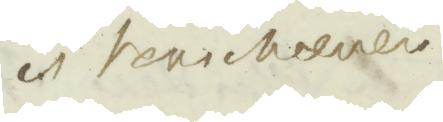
is verscheenen
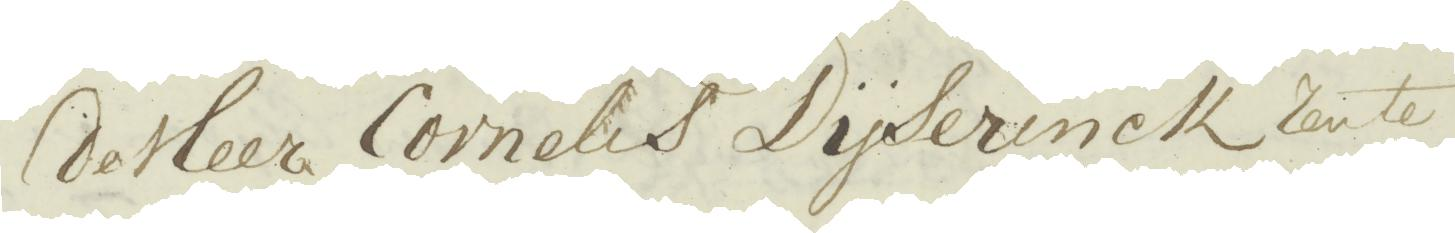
de Heer Cornelis Dijserinck rente
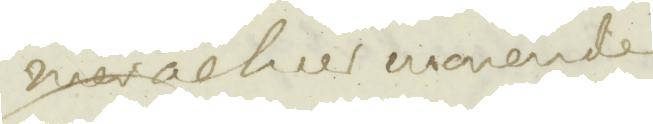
nier alhier wonende
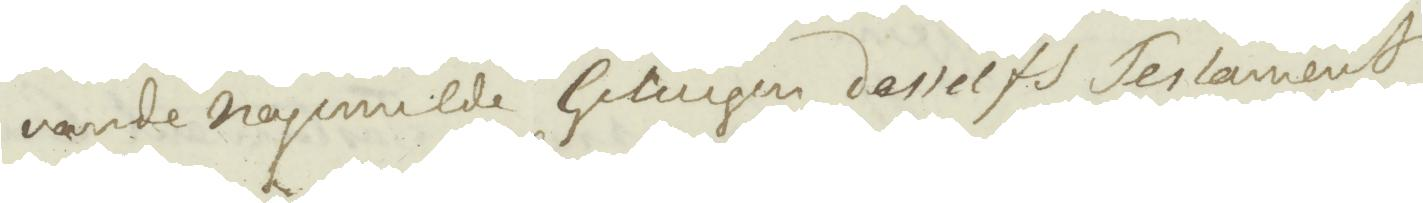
van de nagemelde Getuigen desselfs Testament
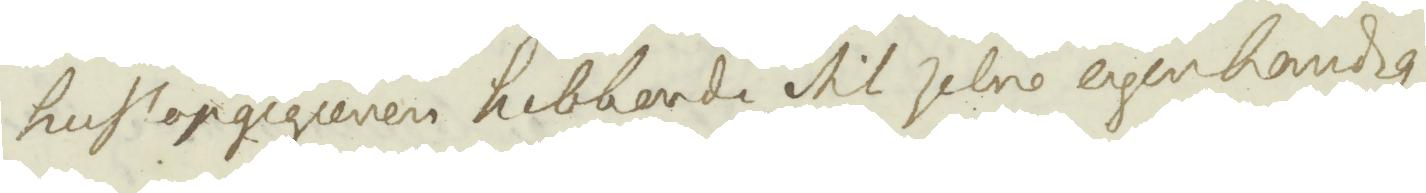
heeft opgegeeven hebbende ik 't zelve eigenhandig
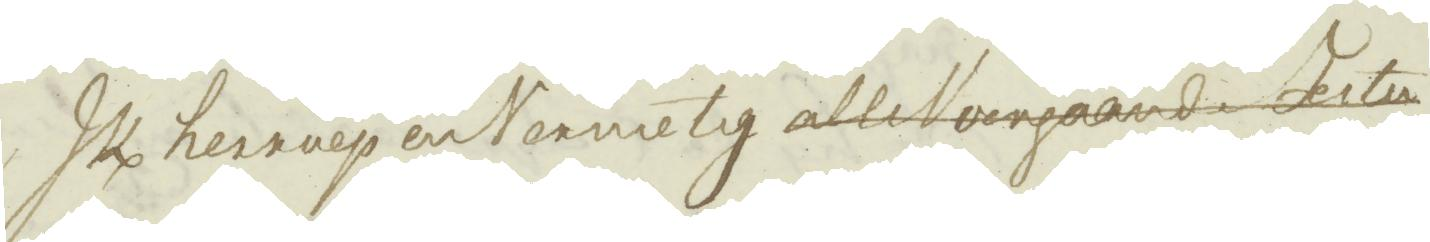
Jk herroep en Vernietig alle Voorgaande Testa
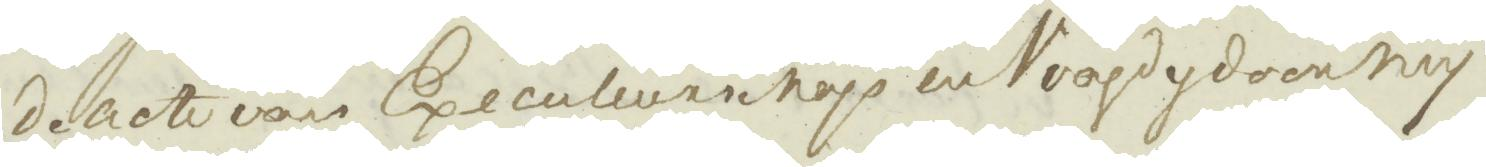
de acte van Executeurschapp en Voogdy door my
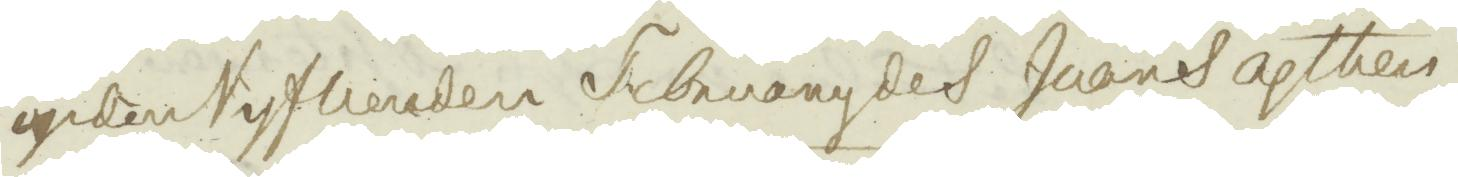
op den Vijftienden February des Jaars agttien
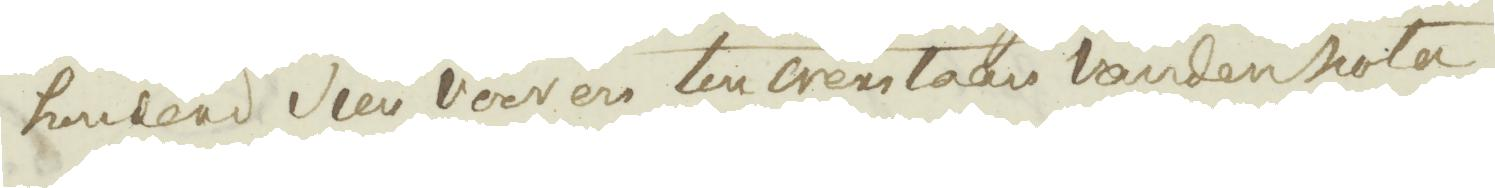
honderd Tien voor en ten overstaan van den nota
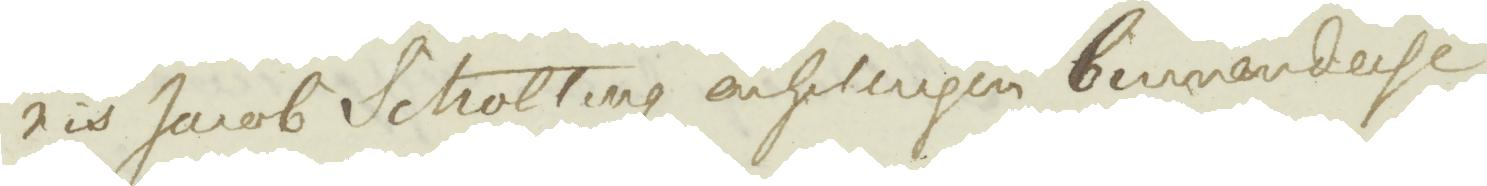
ris Jacob Scholting en getuigen binnen deese
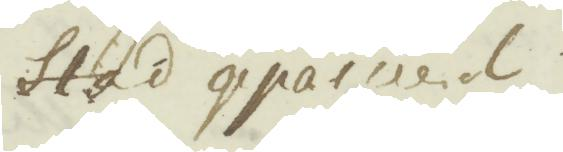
stad gepasseerd
